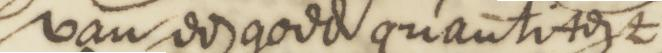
van een goede quantitejt
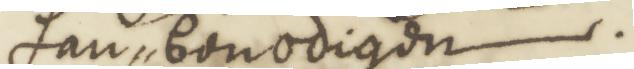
fan„s benodigen.
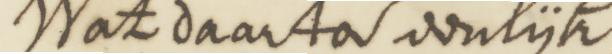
Wat daartoe eenlijk
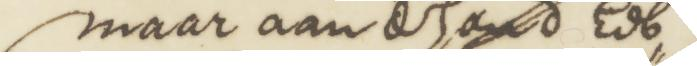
maar aan de hand heb„
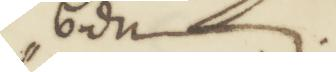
„ben.
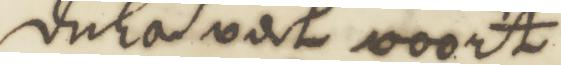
Enhoe vel voor’t
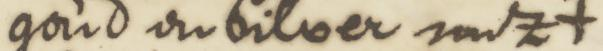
goud en silver met ’t
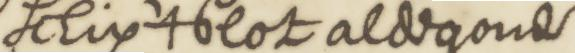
schip ’t slot aldegonde
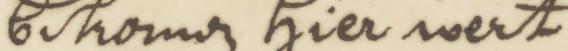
bekomen hier wert
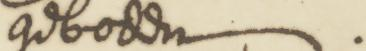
geboden.
